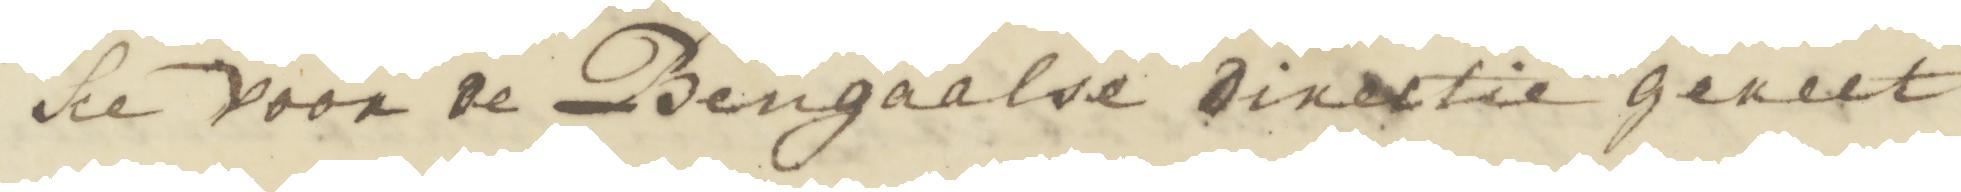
ke voor de Bengaalse directie gereet
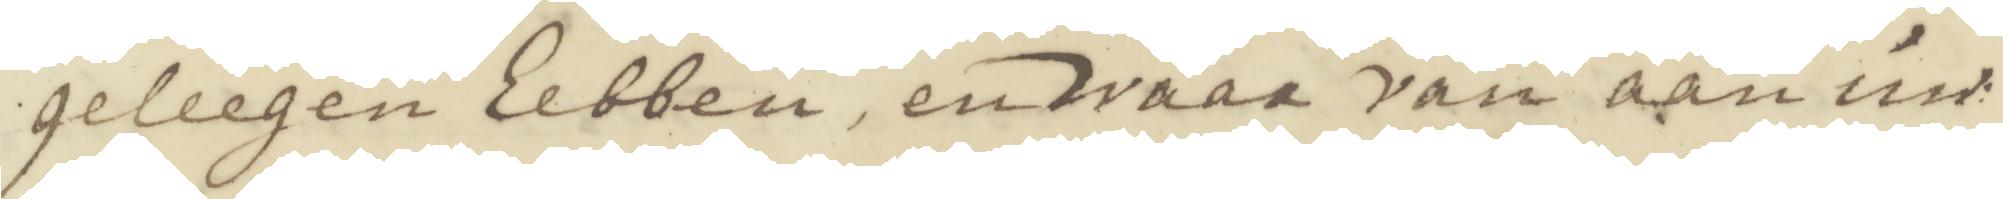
geleegen hebben, en waar van aan uw:
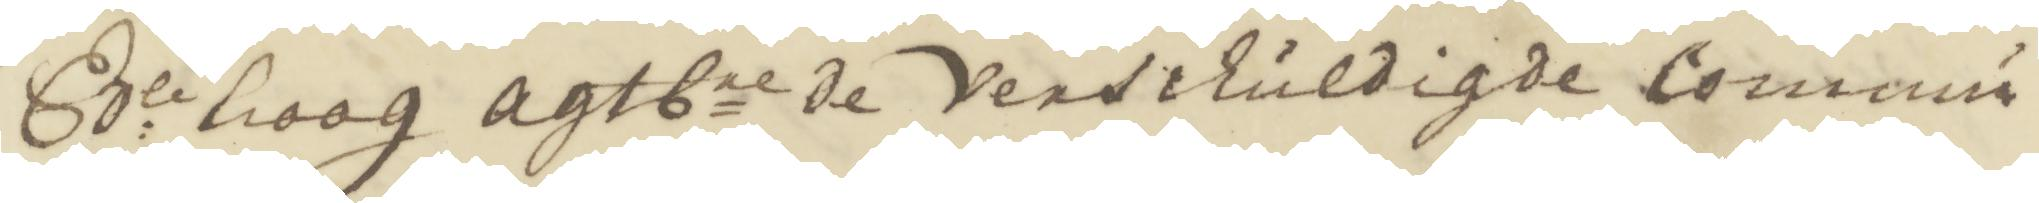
Ed:le hoog agtb=re de verschuldigde Commu
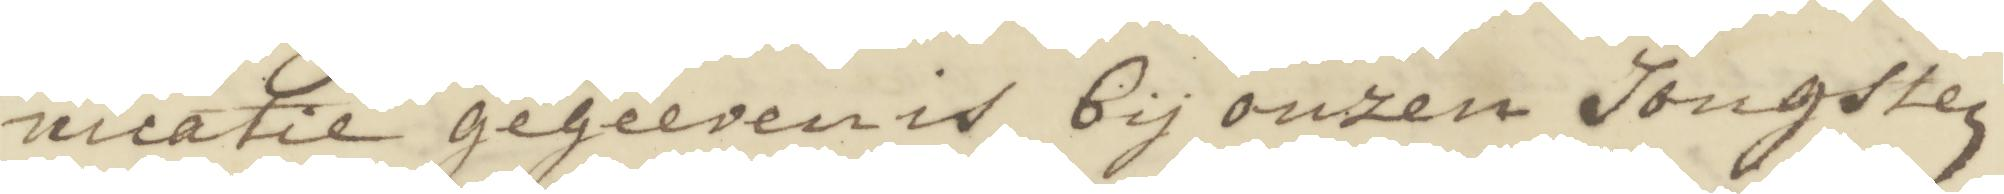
nicatie gegeeven is bij onzen Jongsten
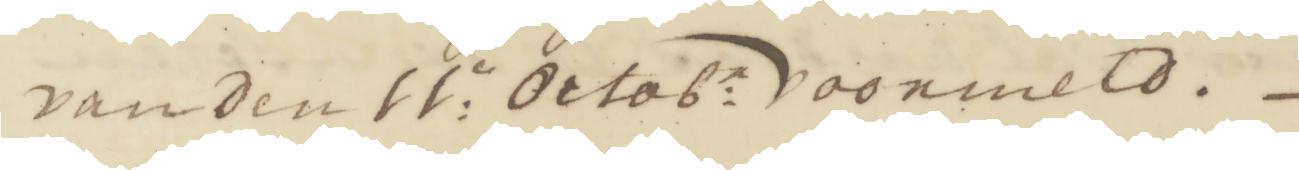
van den 11:e Octob:r voormeld.
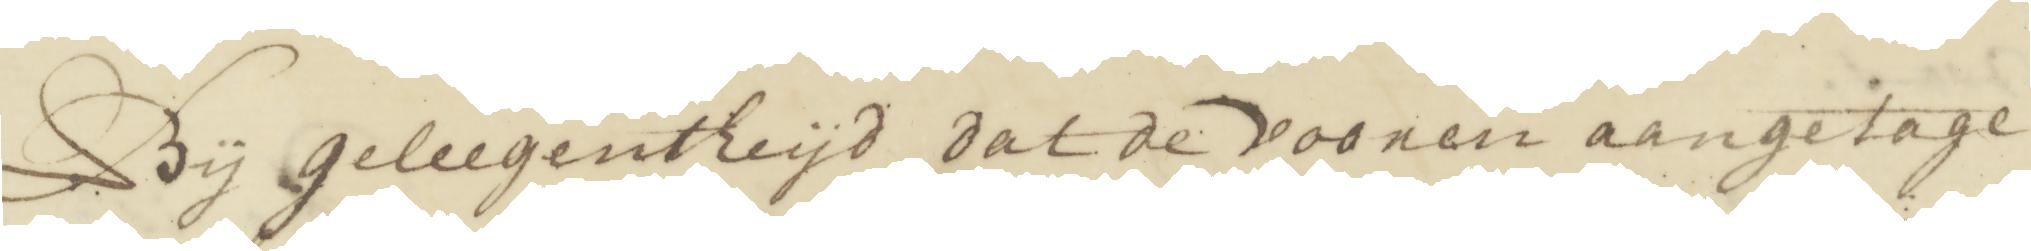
Bij geleegentheijd dat de vooren aangetage
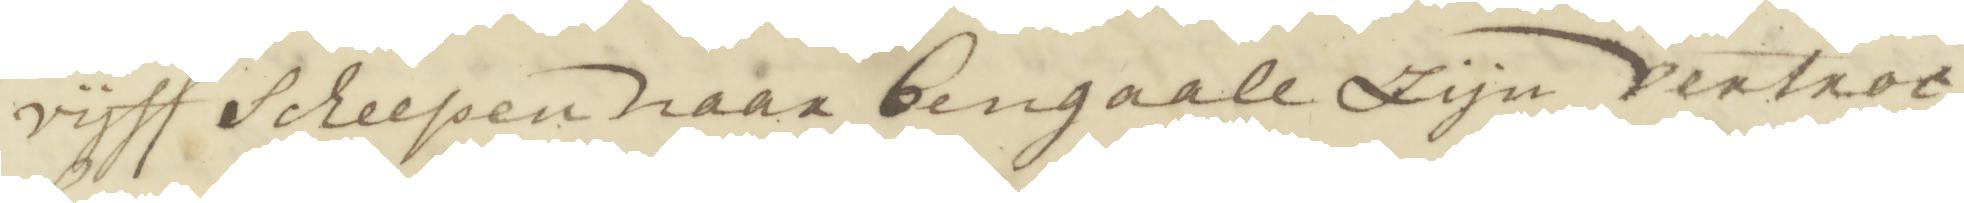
vijff scheepen naar bengaale zijn vertroc
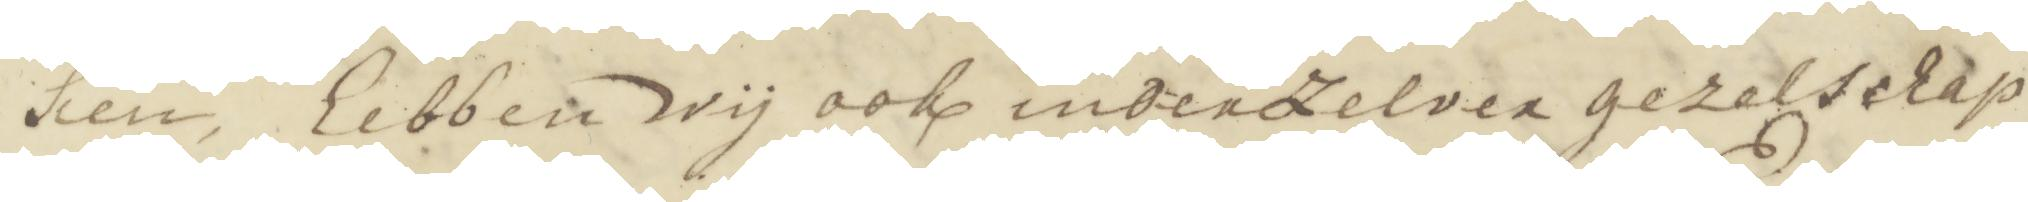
ken, hebben wij ook inder zelver gezelschap
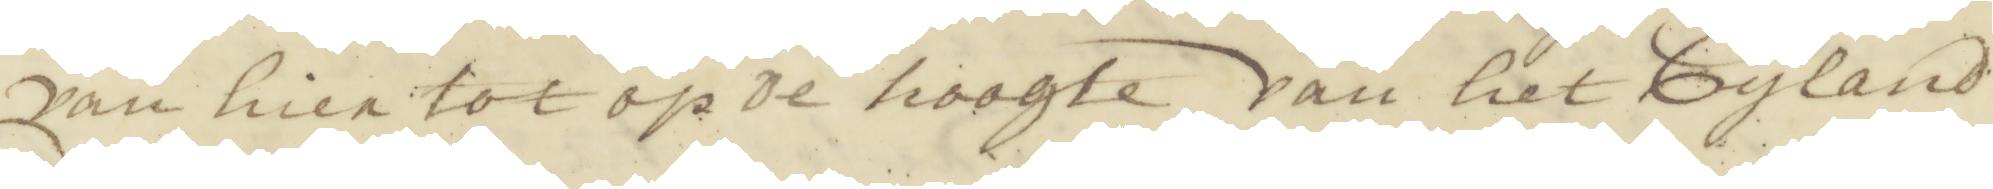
van hier tot op de hoogte van het Eijland
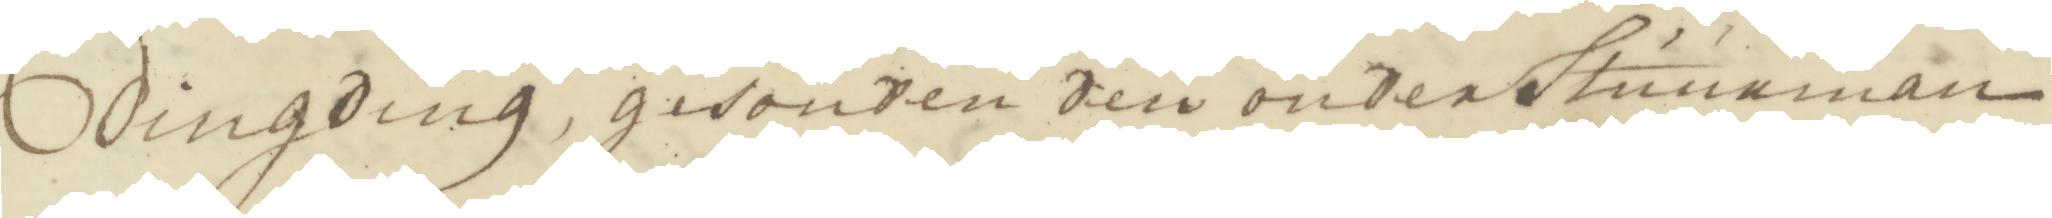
Dingding, gesonden den onder Stuurman
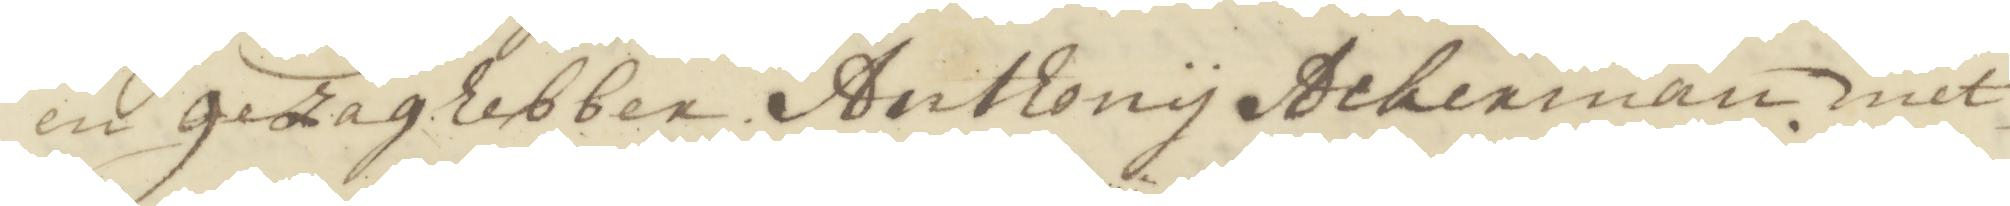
en gezaghebber Anthonij Ackerman met
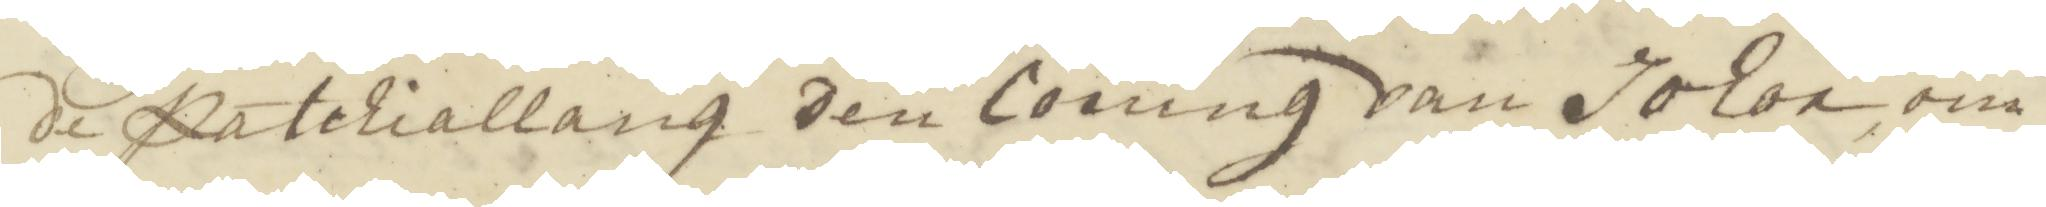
de Patchiallang den Coning van Iohor, om
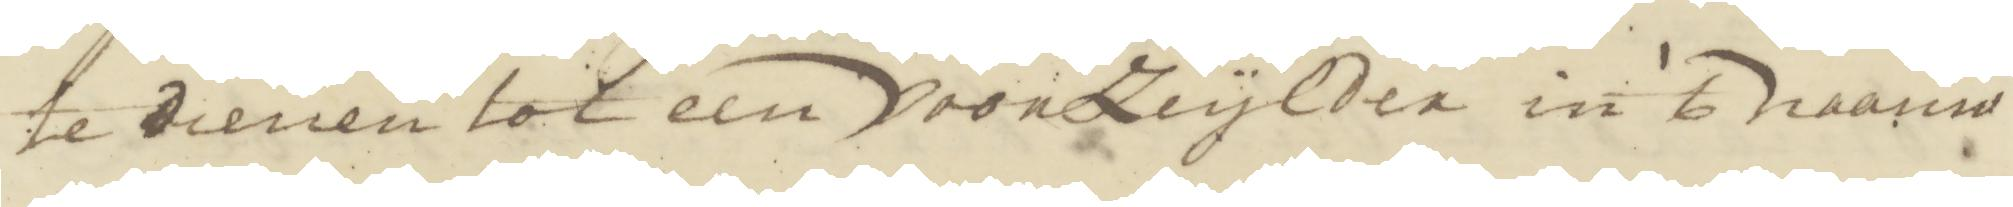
te dienen tot een voorZeijlder in ’t naauw
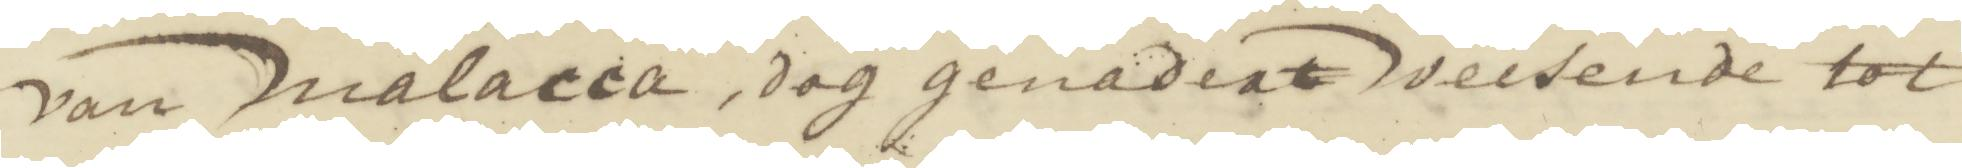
van malacca, dog genadert weesende tot
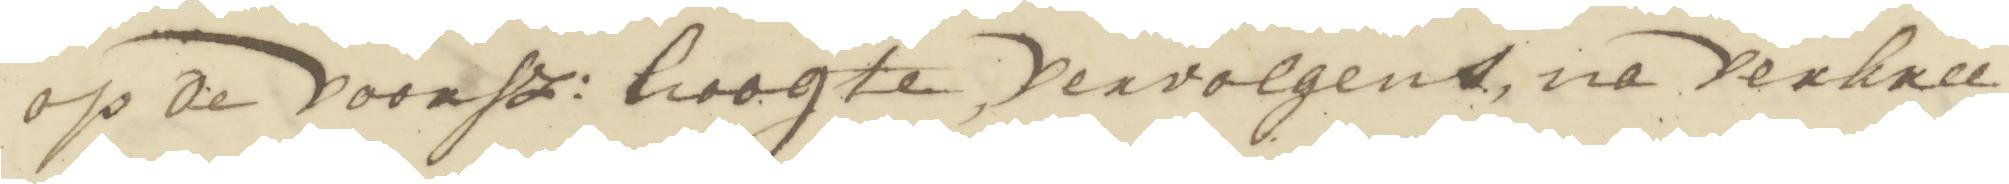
op de voorsz: hoogte vervolgens, na verkree
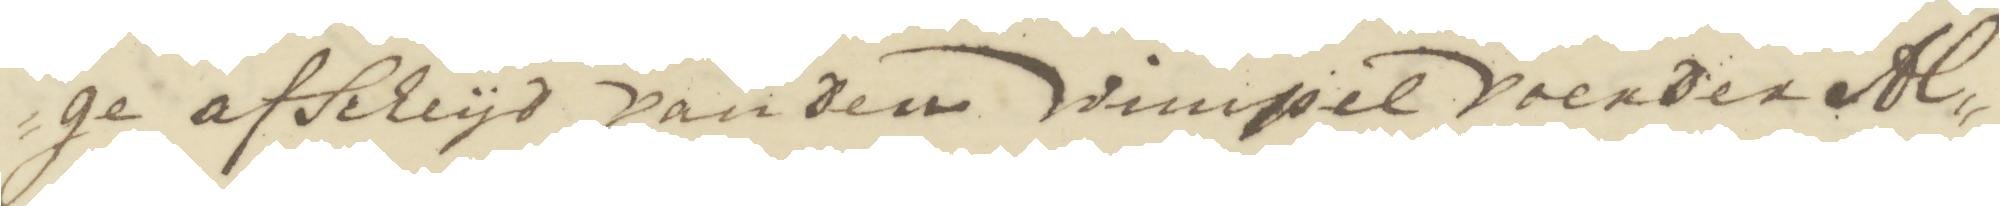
„ge afscheijd van den wimpel voerder Al„
